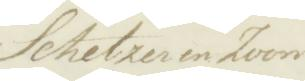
Schetzer en Zoon
